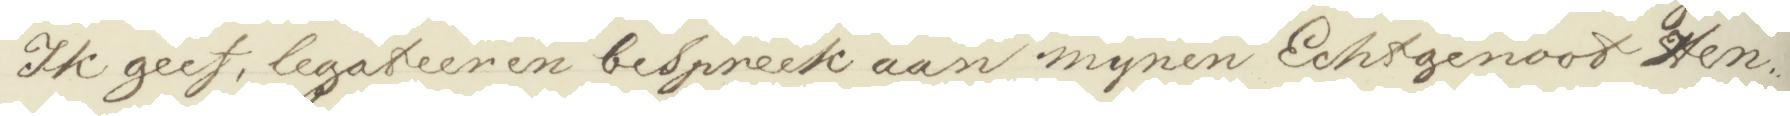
Ik geef, legateeren bespreek aan mynen Echtgenoot Hen„
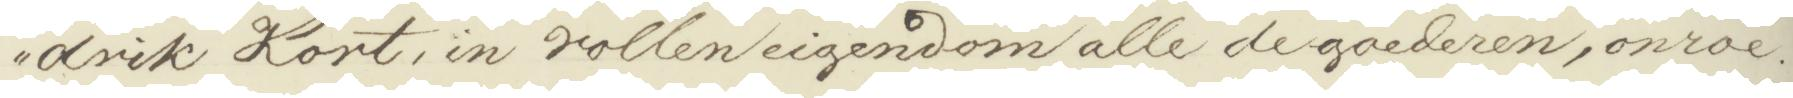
„drik Kort, in vollen eigendom alle de goederen, onroe
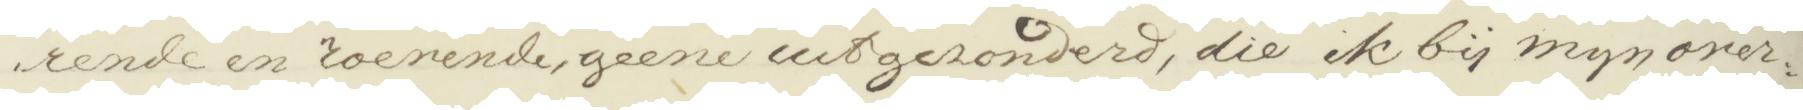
,rende en roerende, geene uitgezonderd, die ik bij myn over:
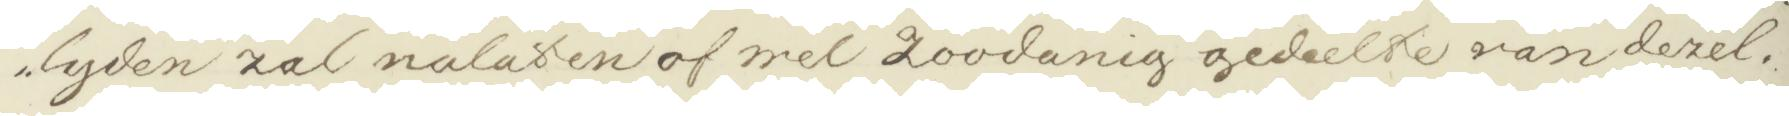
„lyden zal nalaten of wel zoodanig gedeelte van dezel„
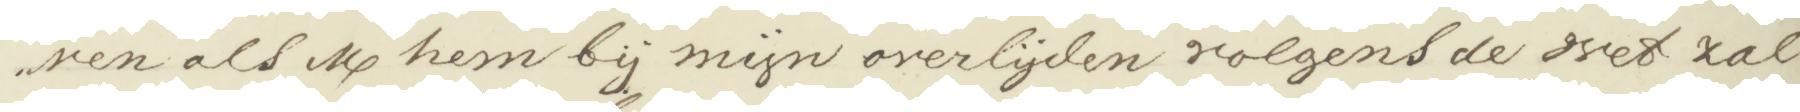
„ven als ik hem bij mijn overlijden volgens de wet zal
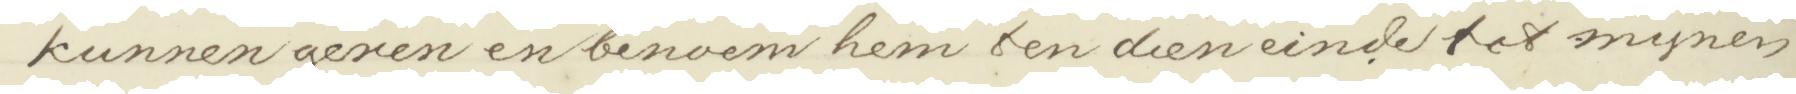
kunnen geven en benoem hem ten dien einde tot mynen
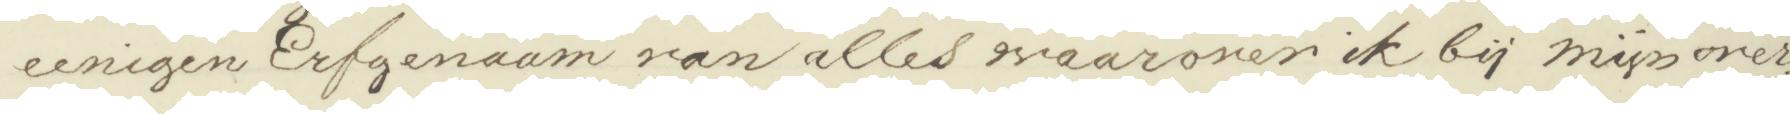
eenigen Erfgenaam van alles waarover ik bij mijn over
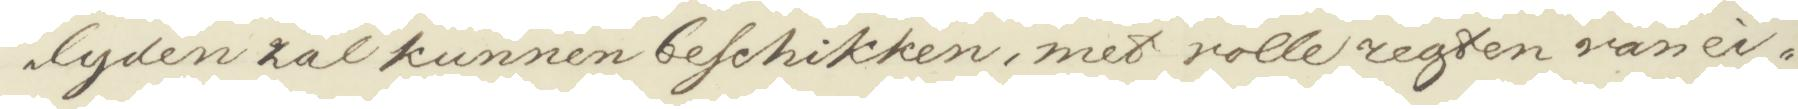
lyden zal kunnen beschikken, met volle regten van ei„
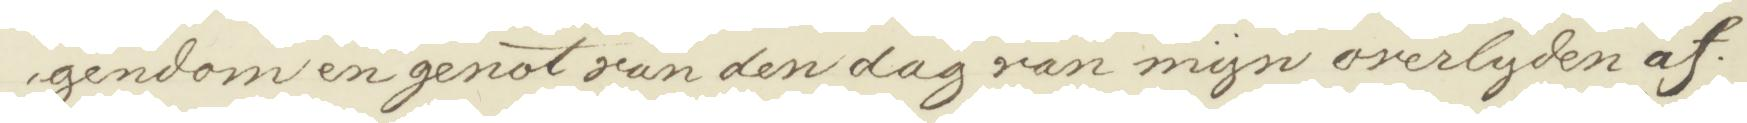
,gendom en genot van den dag van mijn overlyden af.
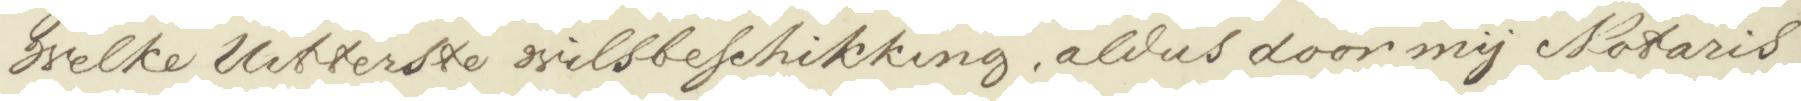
welke Uitterste wilsbeschikking, aldus door mij Notaris
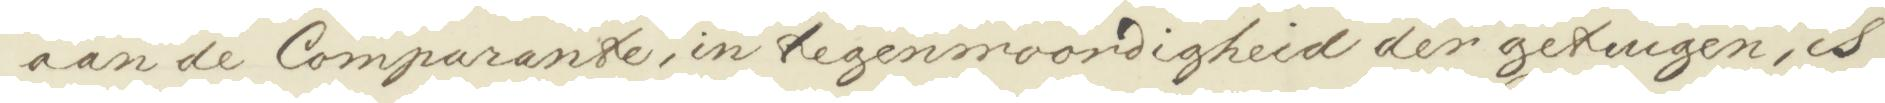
aan de Comparante, in tegenwoordigheid der getuigen, is
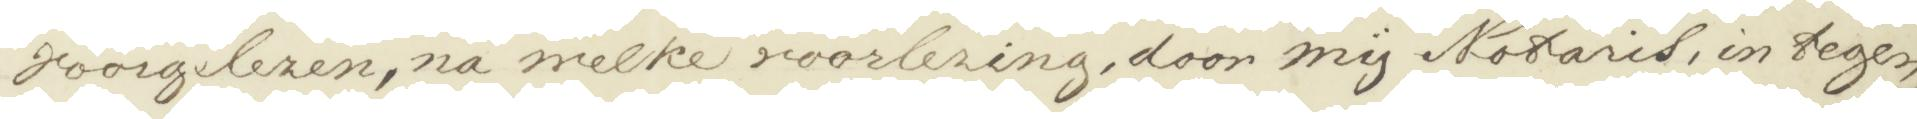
voorgelezen, na welke voorlezing, door mij Notaris, in tege
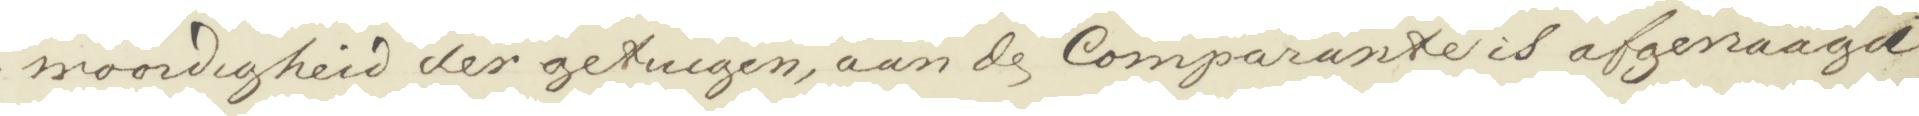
woordigheid der getuigen, aan de Comparante is afgenaagd
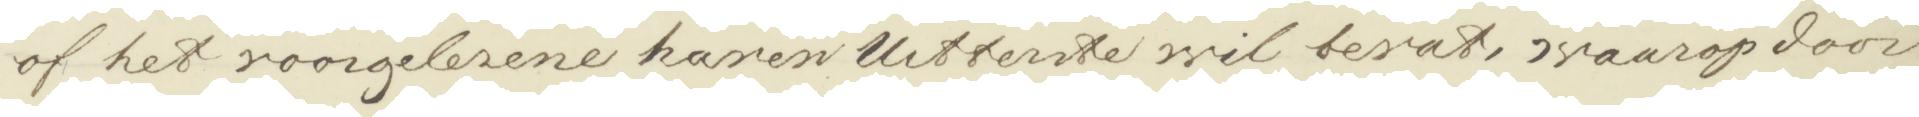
of het voorgelezene haren Uitterste wil bevat, waarop door
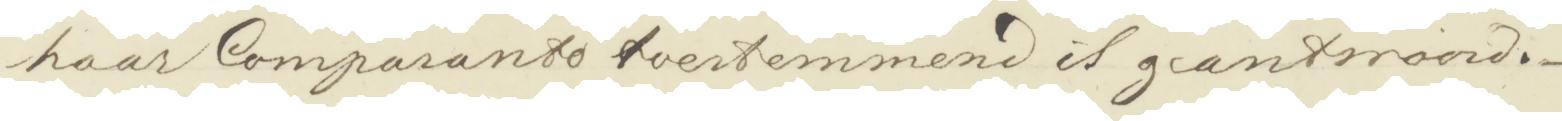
haar Comparante toestemmend is geantwoord.
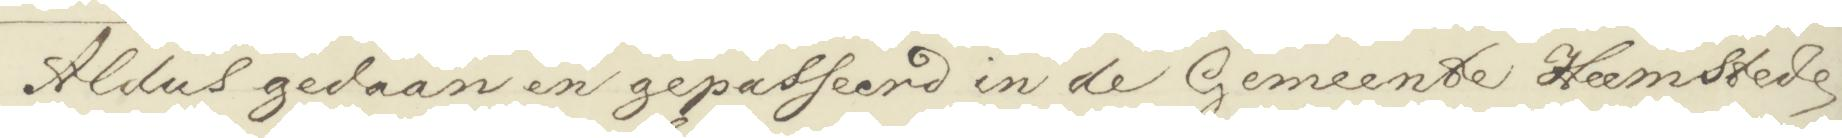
Aldus gedaan en gepasseerd in de Gemeente Heemstede
